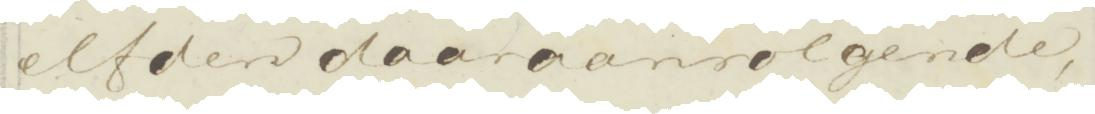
elfden daaraanvolgende,
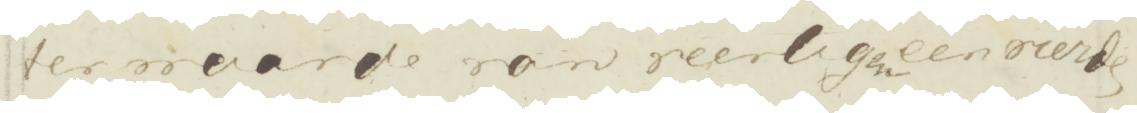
ter waarde van veertig en een vierde
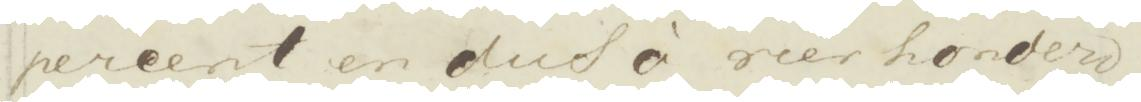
percent en dus à vier honderd
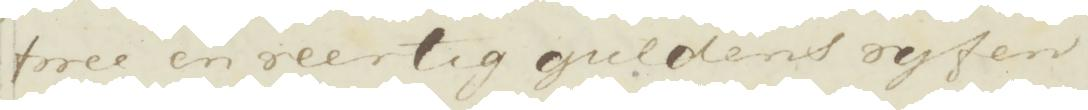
twee en veertig guldens vyf en
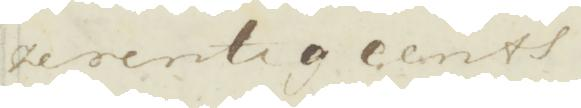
zeventig cents – – — – —
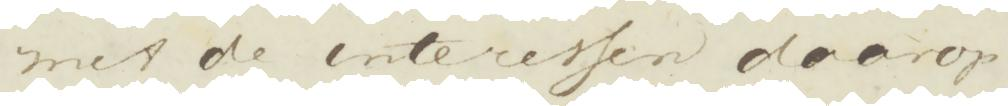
met de interessen daarop
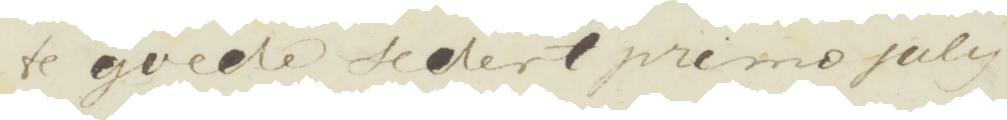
te goede sedert primo july
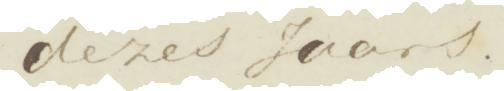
dezes Jaars.
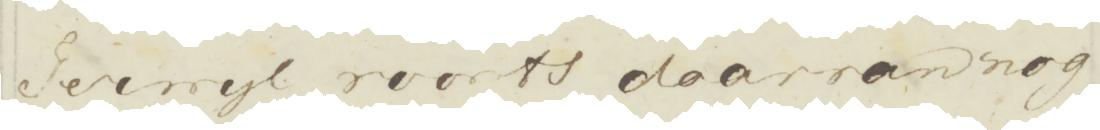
Terwyl voorts daar van nog
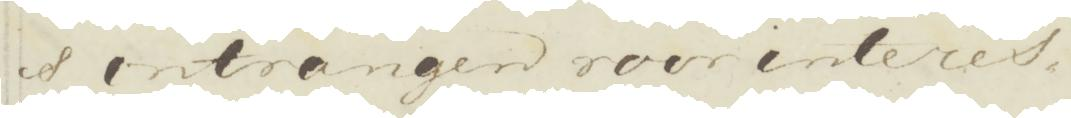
is ontvangen voor interes„
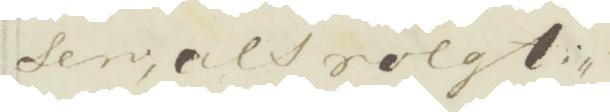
sen, als volgt;„
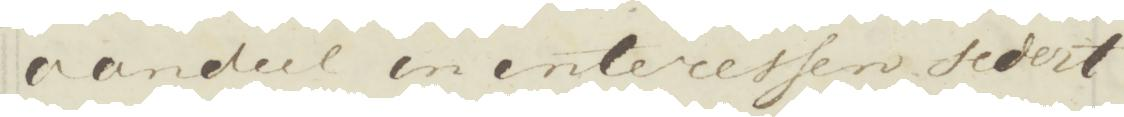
aandeel in interessen sedert
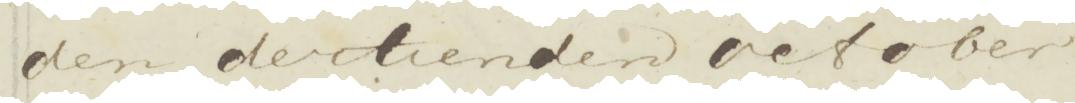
den dertienden october
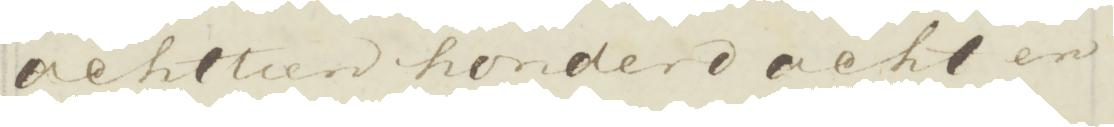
achttien honderd acht en
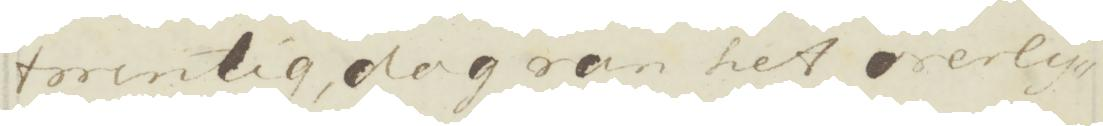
twintig, dag van het overly„
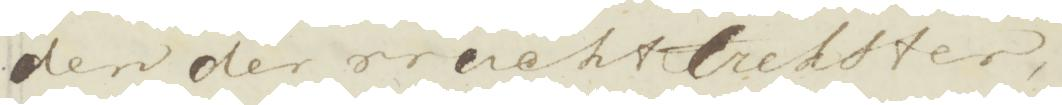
„den der vruchttrekster,
